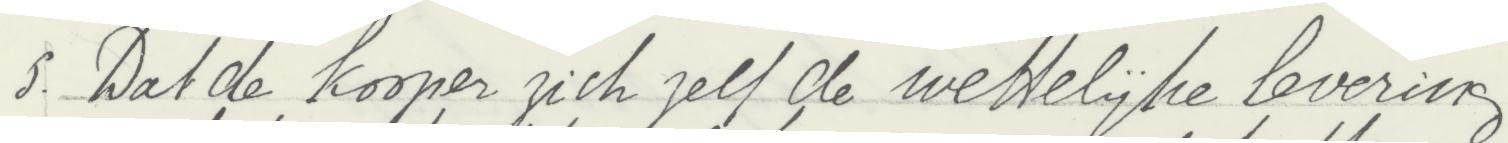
5. Dat de kooper zich zelf de wettelijke levering
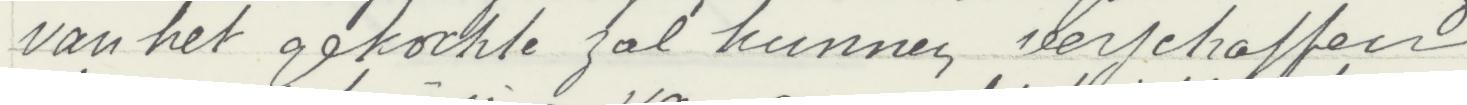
van het gekochte zal kunnen verschaffen
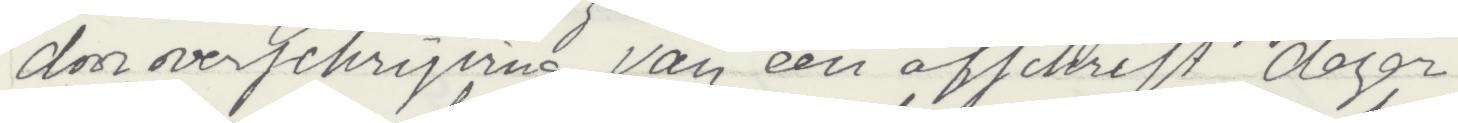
door overschrijving van een afschrift dezer
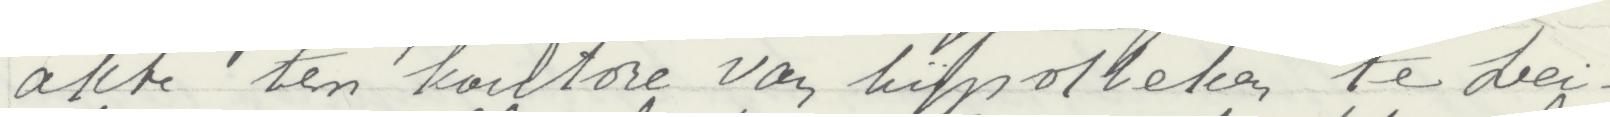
acte ten kantore van hijpotheken te Lei
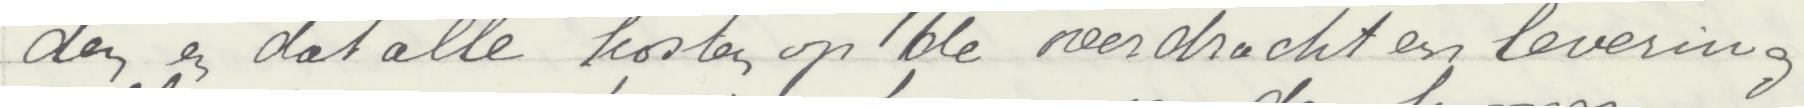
den en dat alle kosten op de overdracht en levering
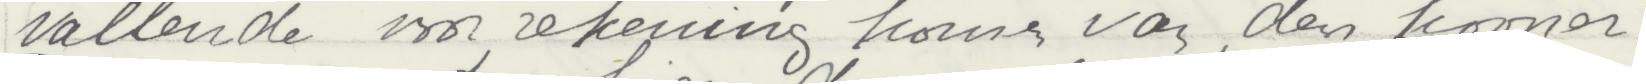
vallende voor rekening komen van den kooper
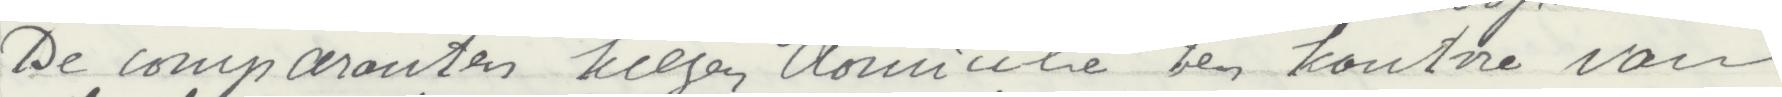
De comparanten kiezen domicilie ten kantore van
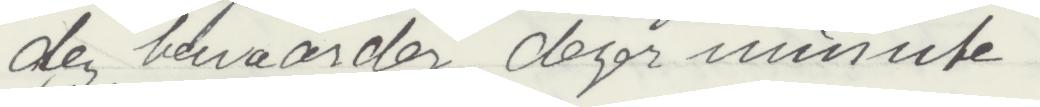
den bewaarden dezer minute
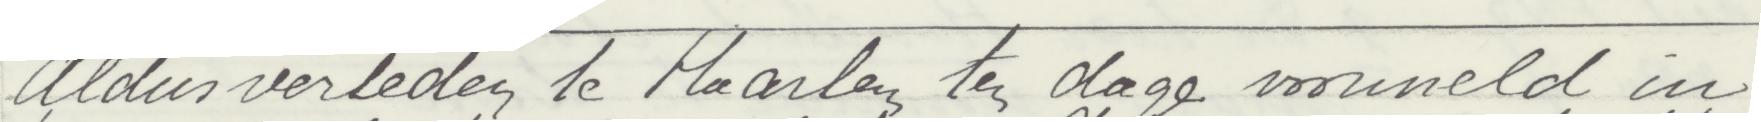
Aldus verleden te Haarlem ten dage voormeld in
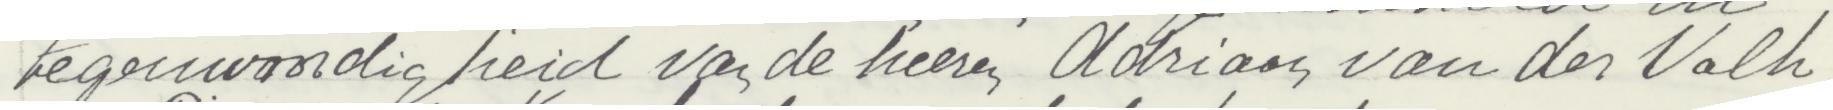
tegenwoordigheid van de heeren Adriaan van den Valk
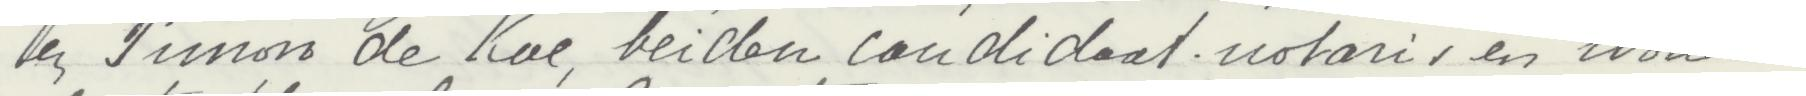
en Timon de Koe, beiden candidaat - notaris en wonen
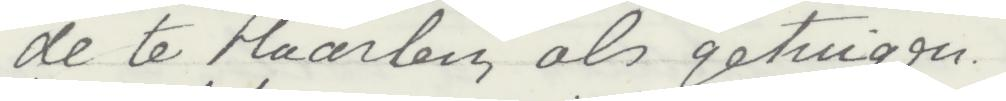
de te Haarlem als getuigen.
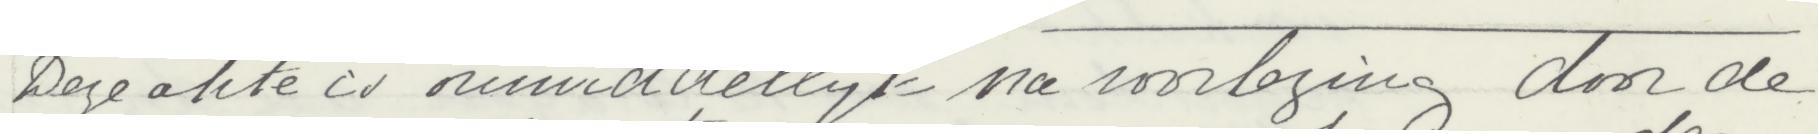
Deze akte is onmiddellijk na voorlezing door de
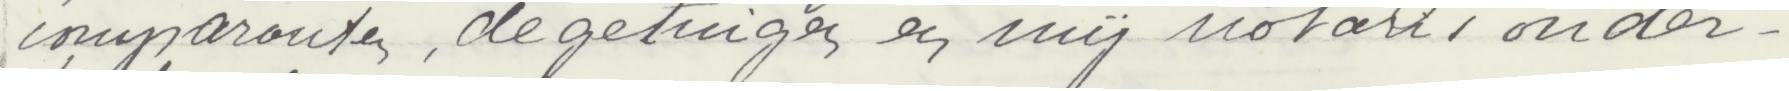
comparanten, de getuigen en mij notaris onder-
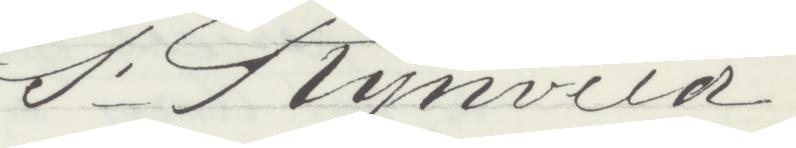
F Rijneveld
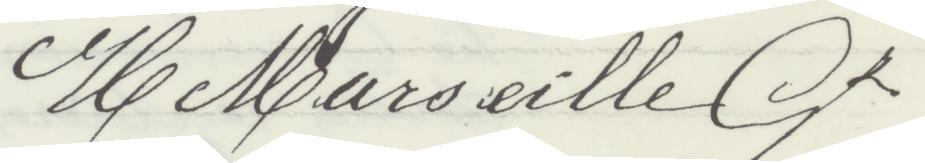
H Marseille Gz
